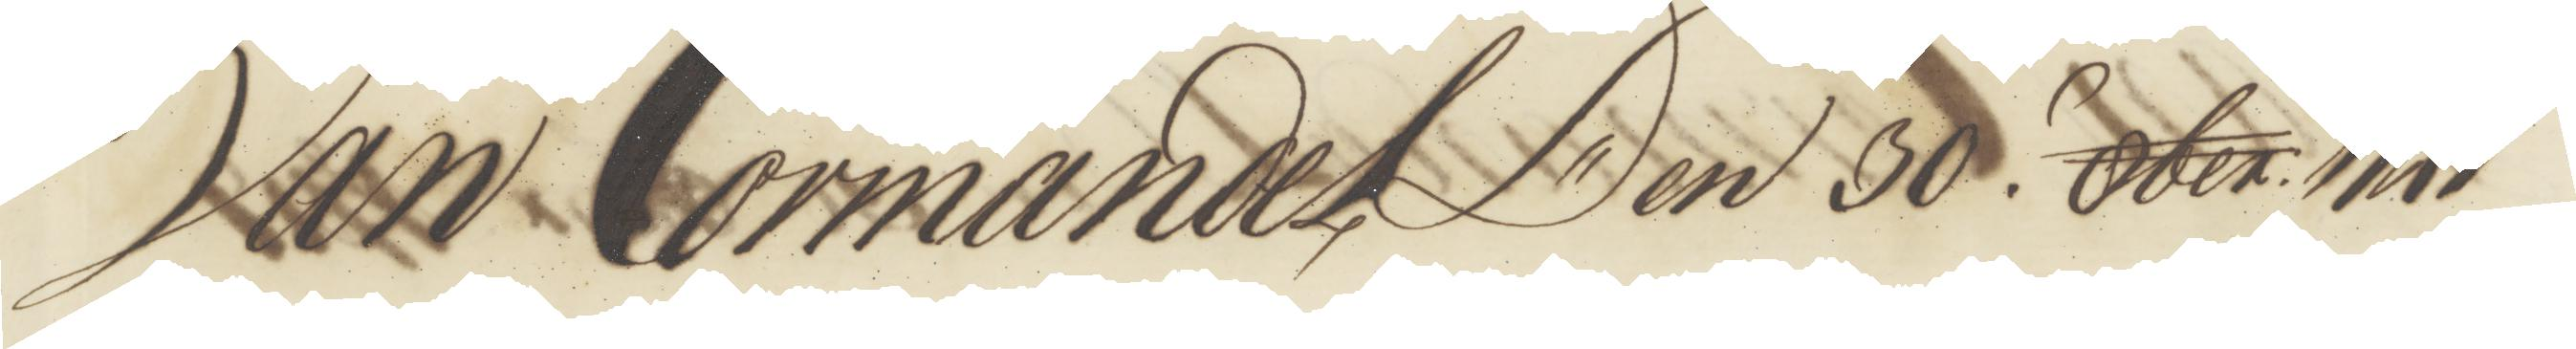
Van Cormandel Den 30.' 8ber: 1747.
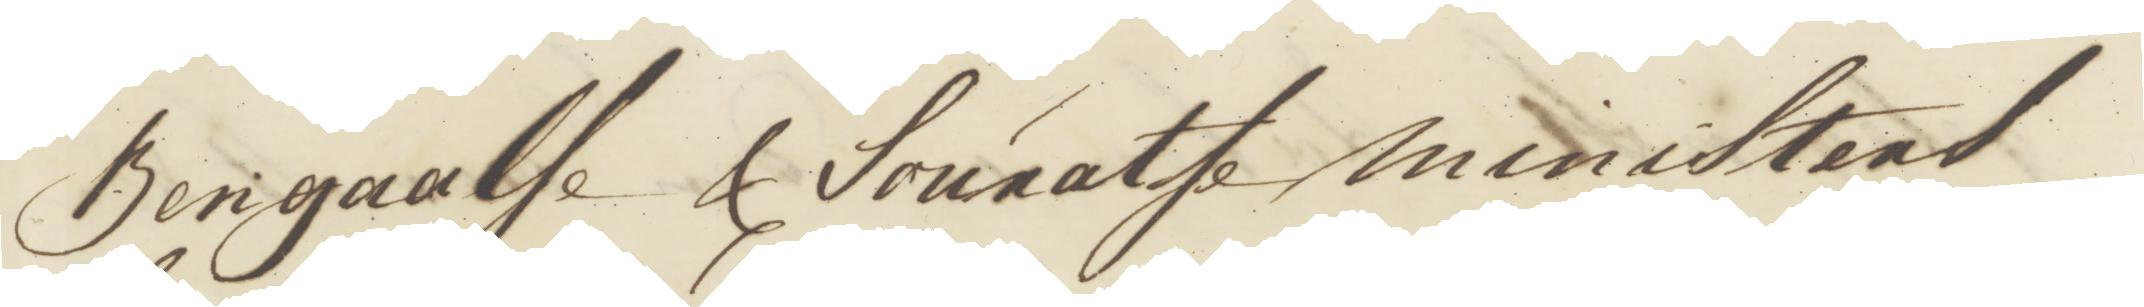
Bengaalse & souratse ministers
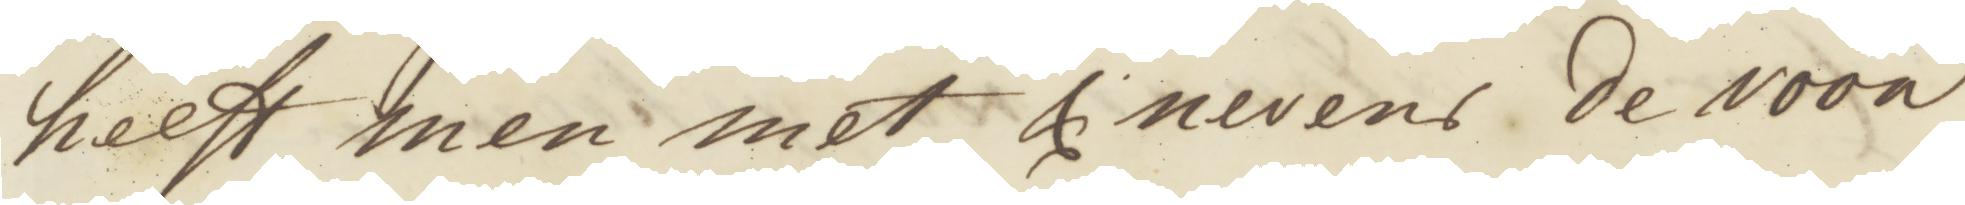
heeft men met & nevens de voor
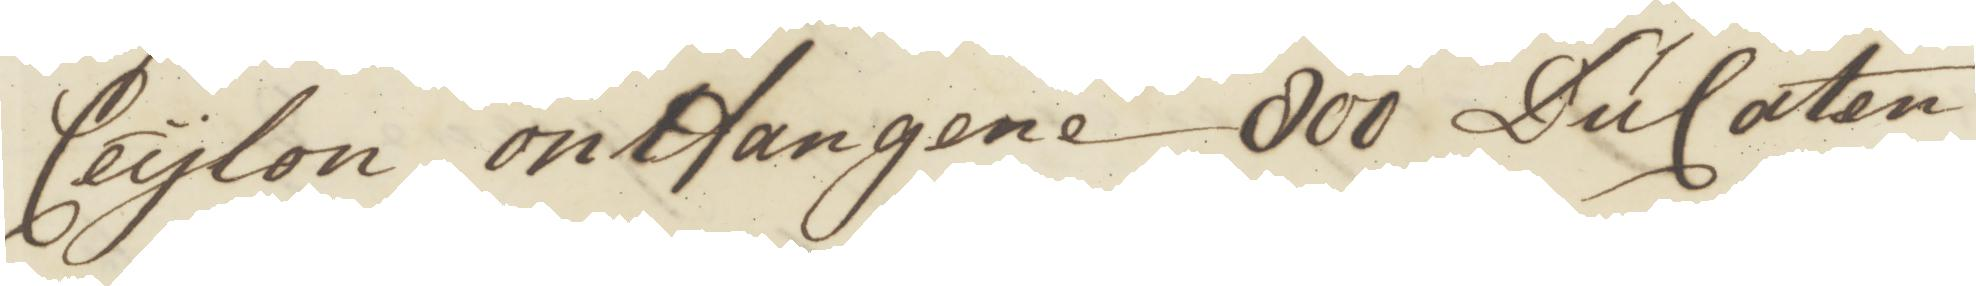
Ceijlon ontfangene 800 Ducaten
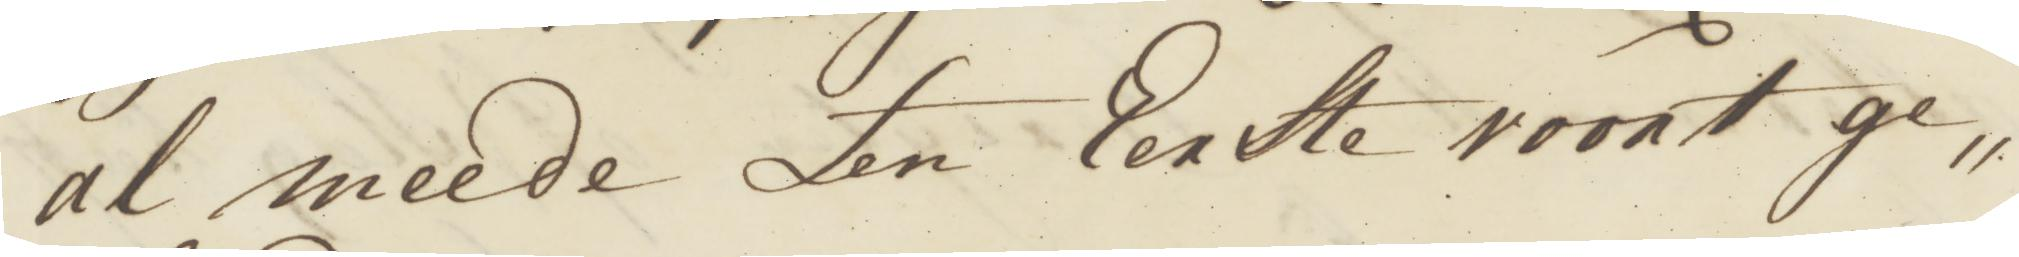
al meede ten Eerste voort ge„
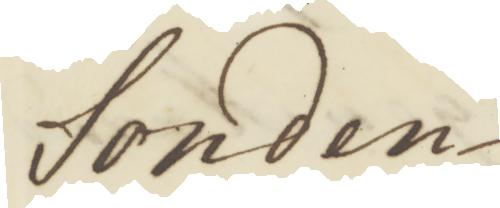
sonden
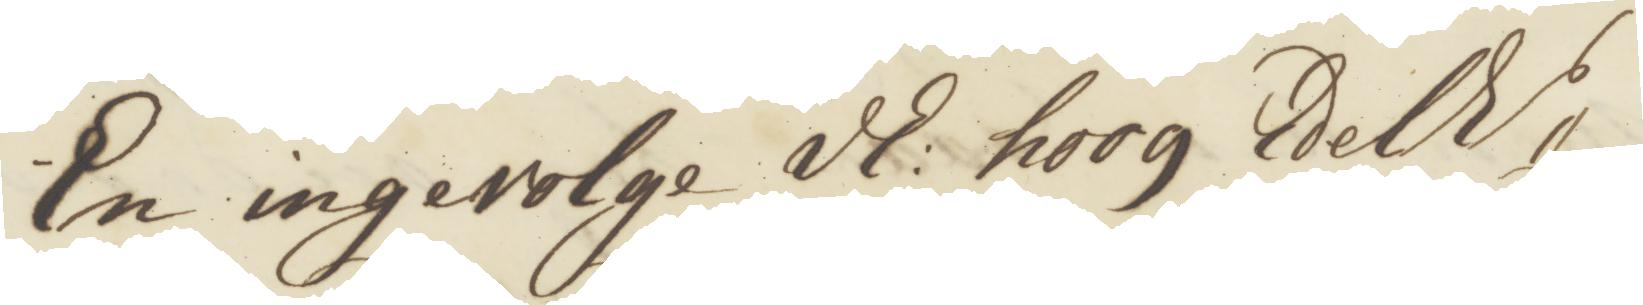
En ingevolge UE: hoog Edelh„s
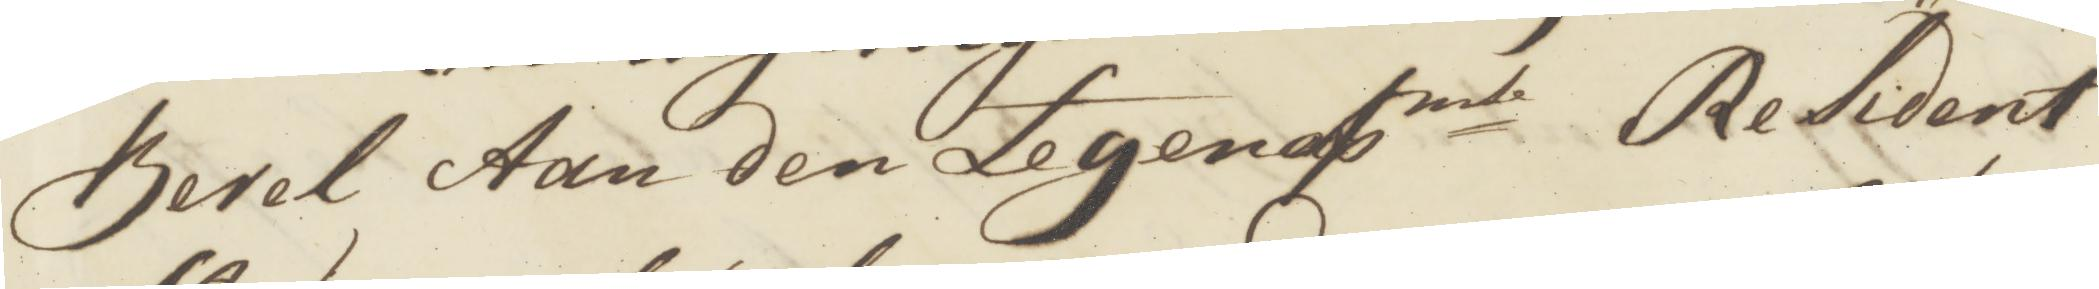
Bevel Aan den tegenap=mse Resident
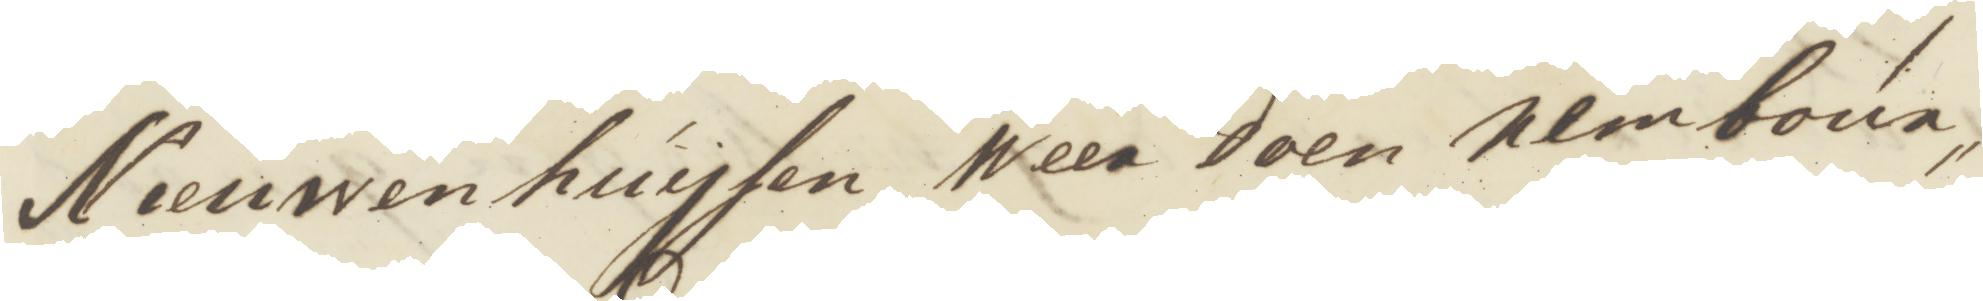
Nieuwen huijsen weer doen rembour„
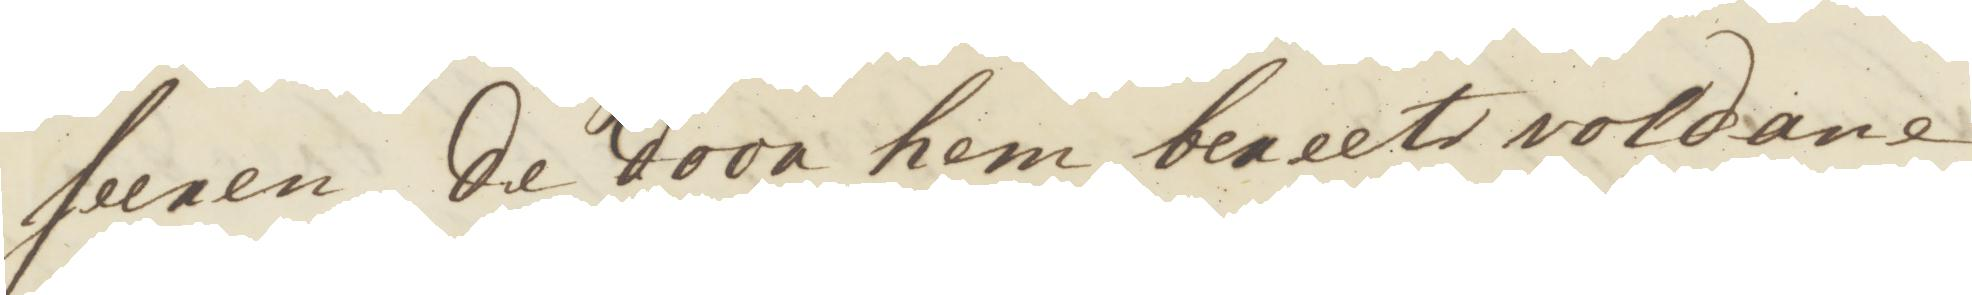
seeren de door hem bereets voldane
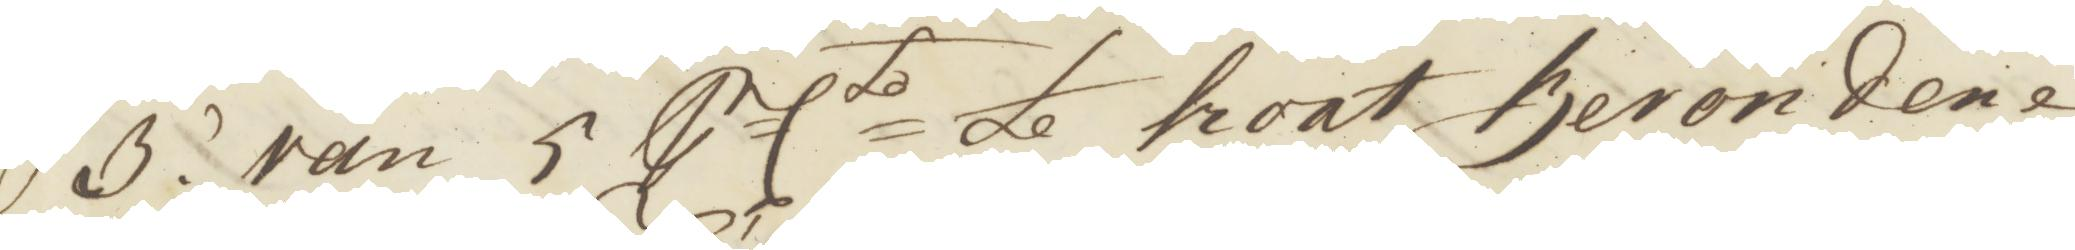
„3.' van 5 P=C=te te kort Bevondene
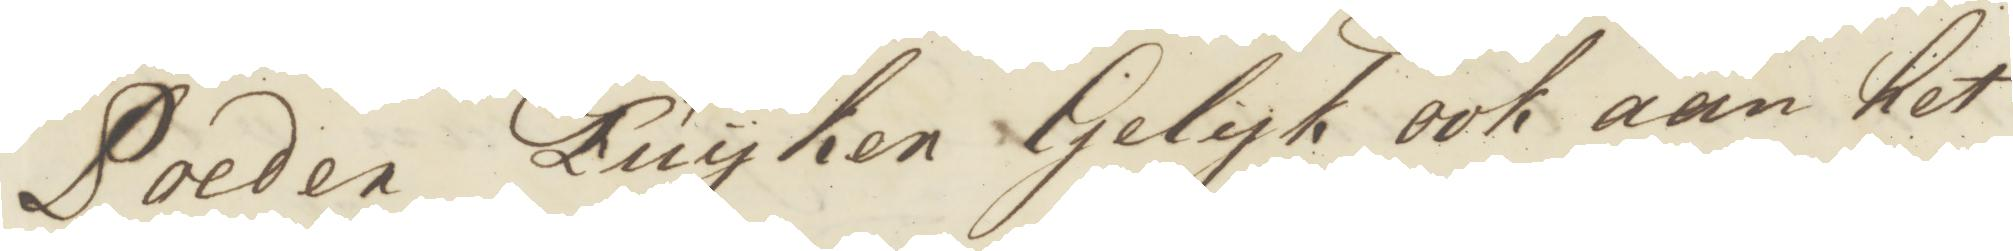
Poeder Zuijker Gelijk ook aan het
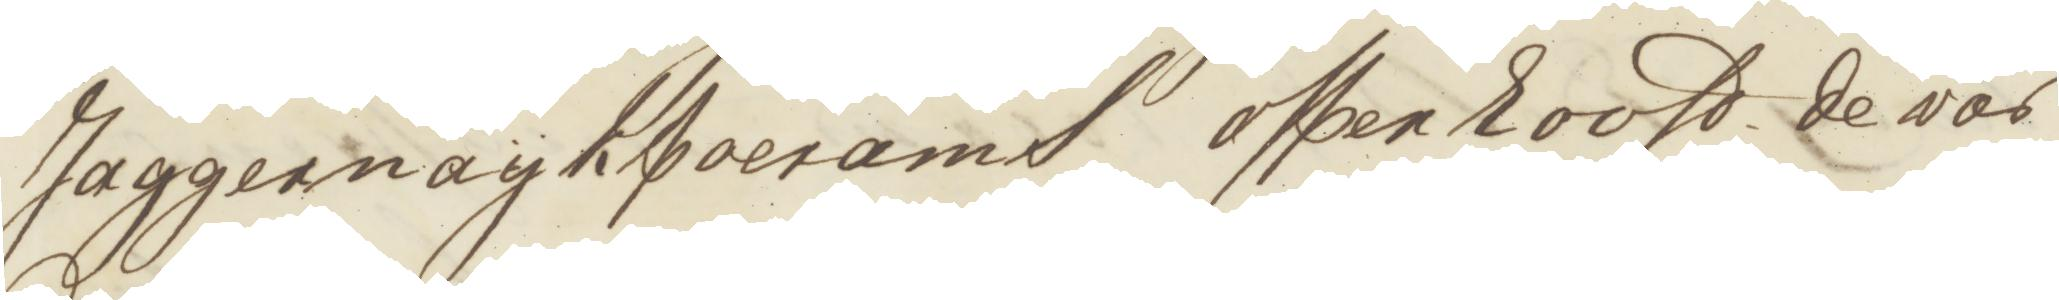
Jaggernaijkpoerams opperhoofd de vos
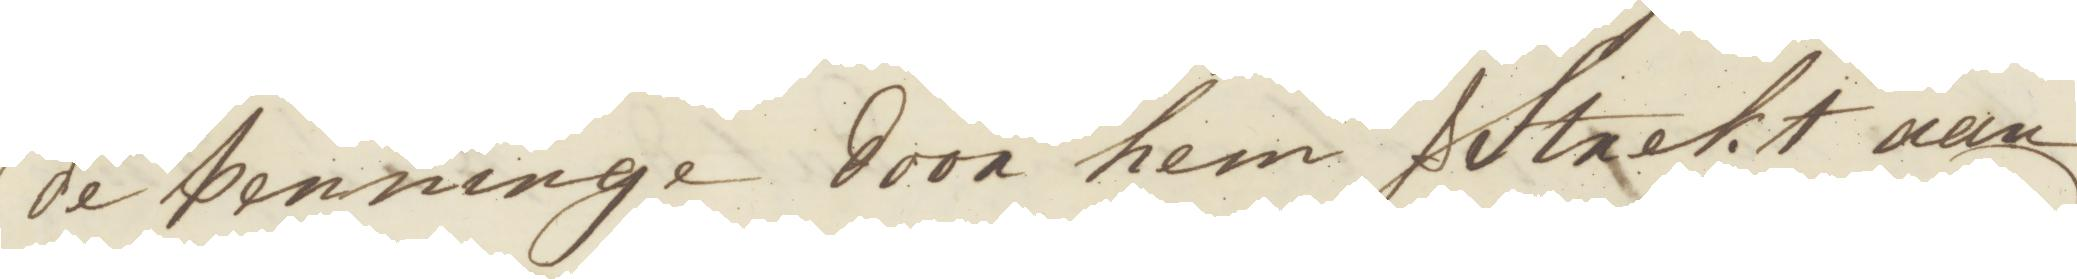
de penninge door hem verstrekt aan
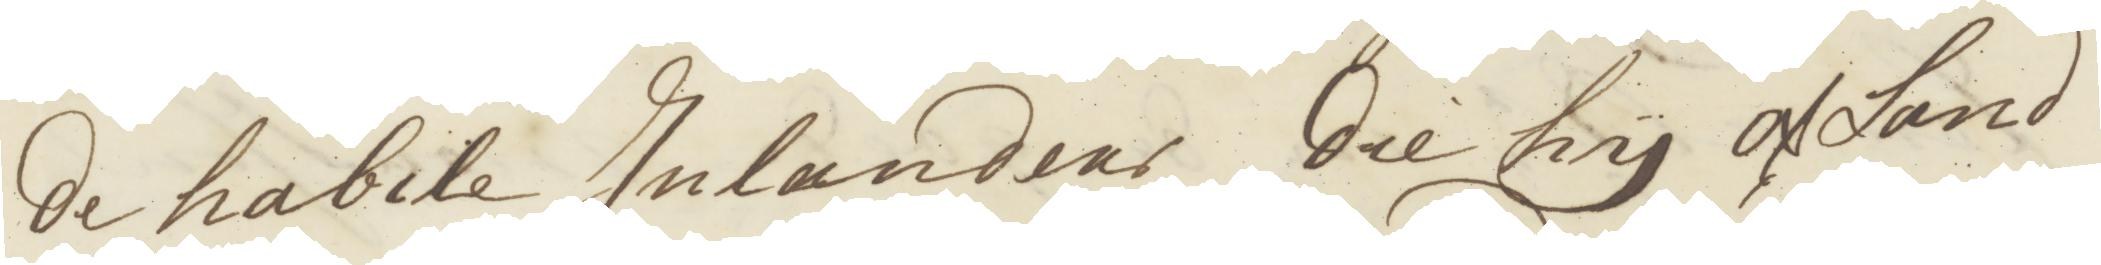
de habile Jnlanders die hij op Land
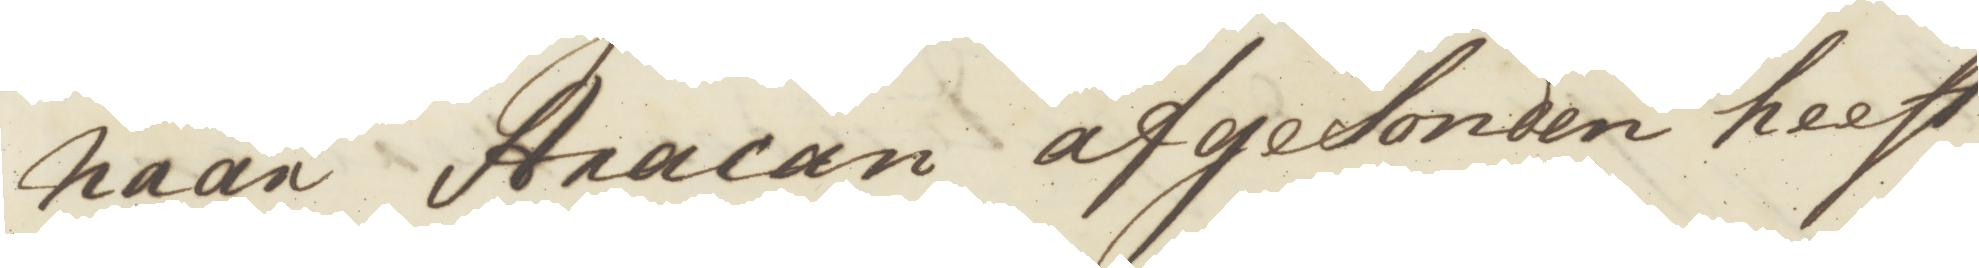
naar Aracan afgesonden heeft
